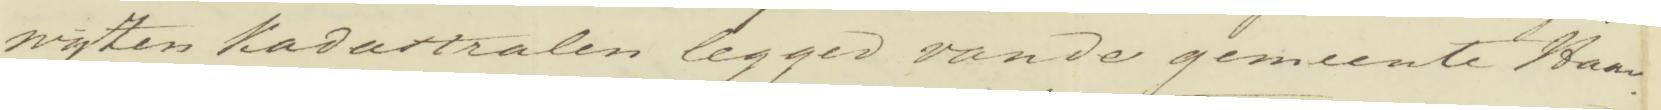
wijZen kadastralen legger van de gemeente Haar
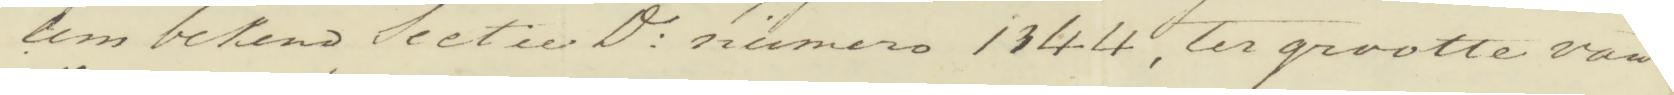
lem bekend sectie D: numero 1344, ter grootte van
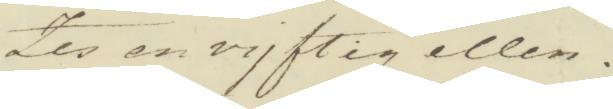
Zes en vijftig ellen.
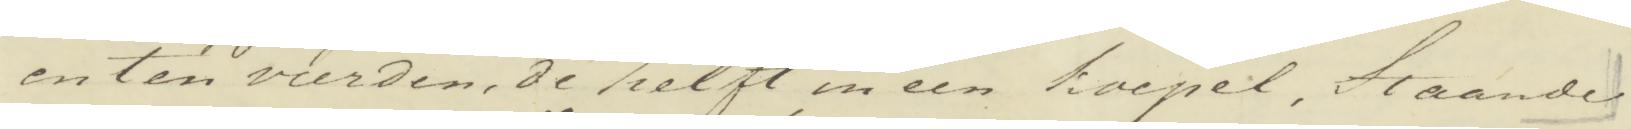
en ten vierden, de helft in een koepel, Staande,
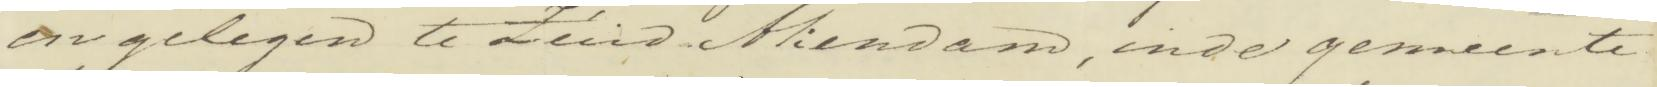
en gelegen te Zuid-Akendam, in de gemeente
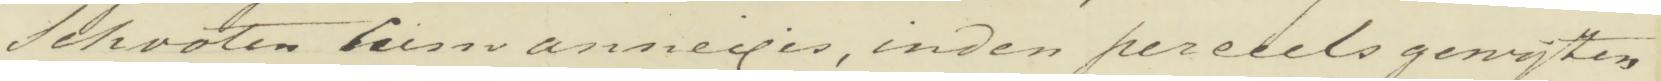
Schooten Cum annexis, in den perceels gewijZen
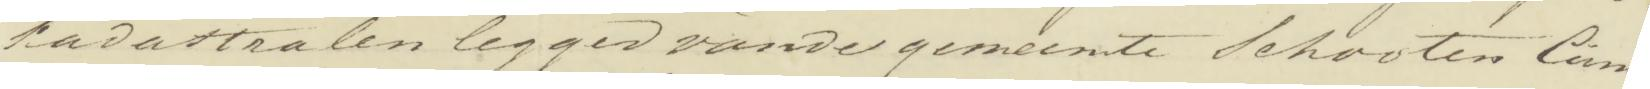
kadastralen legger vande gemeente Schooten Cum
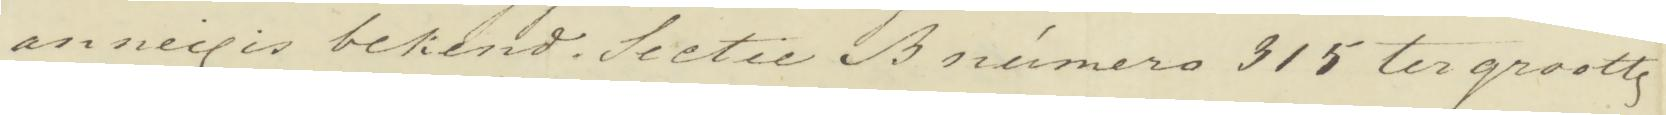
annexis bekend. Sectie B numero 315 ter grootte
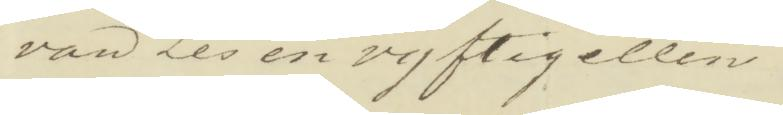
van Zes en vyftig ellen
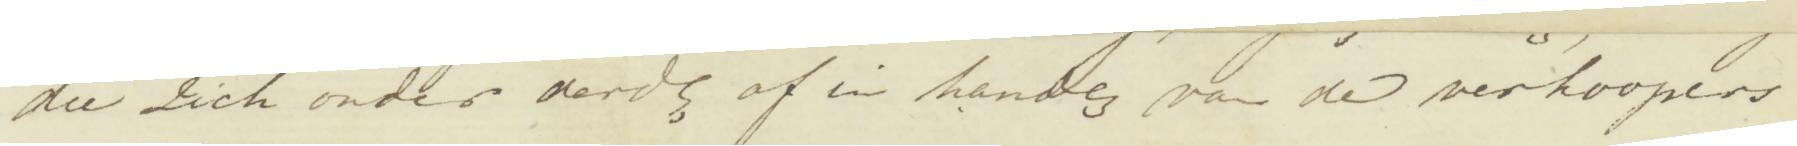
die zich onder derden of in handen van de verkoopers
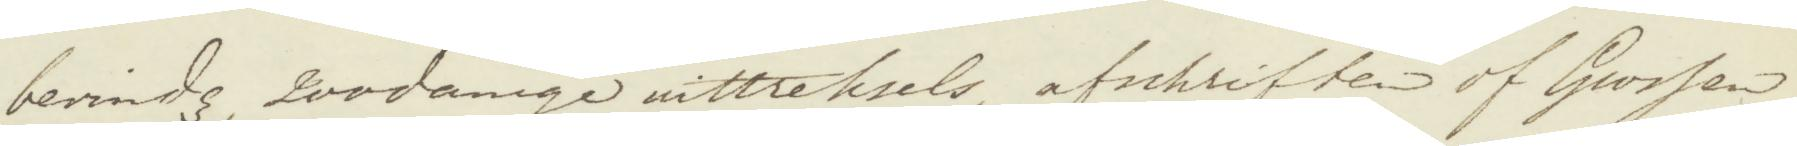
bevinde, zoodanige uittreksels, afschriften of Grossen
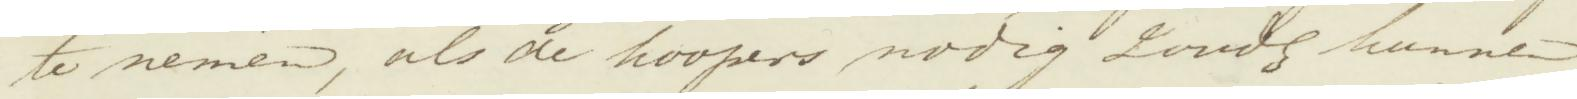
te nemen, als de koopers nodig zoude kunne
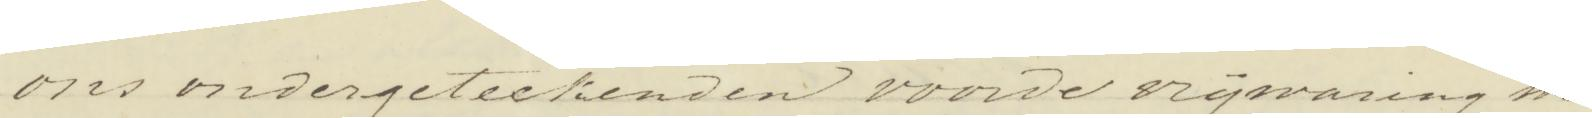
ons ondergeteekenden voorde vrijwaring we
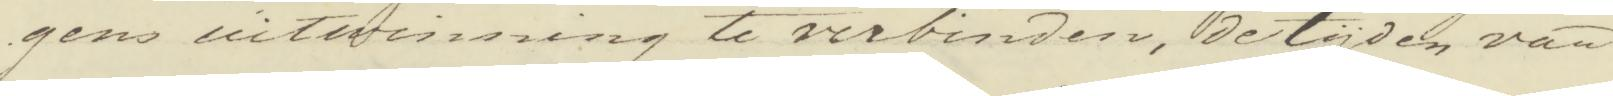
gens uitwinning te verbinden, de tijden van
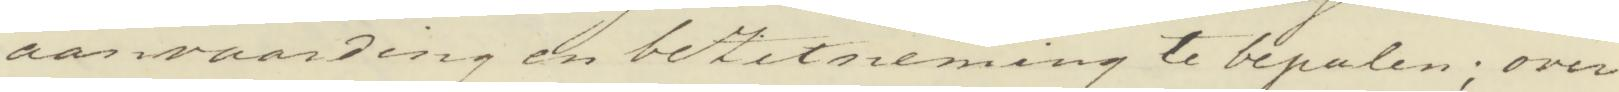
aanvaarding en beZitneming te bepalen; over
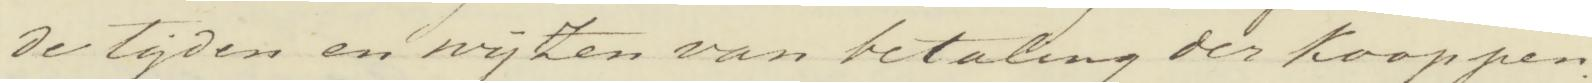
de tijden en wijZen van betaling der Kooppen
